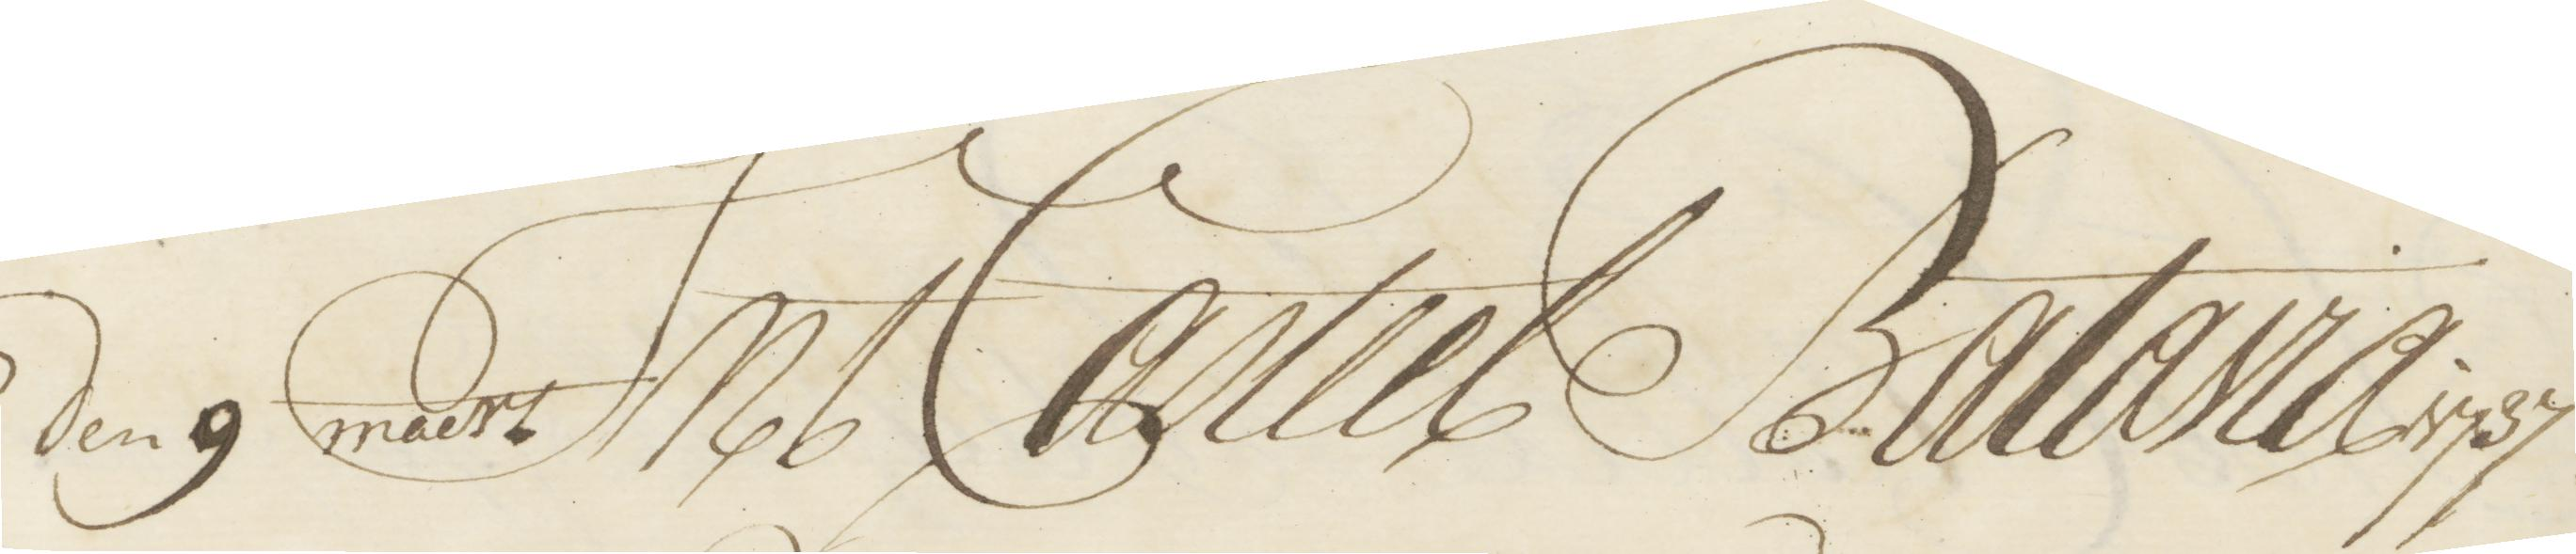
den 9 maert Int Casteel Batavia 1737
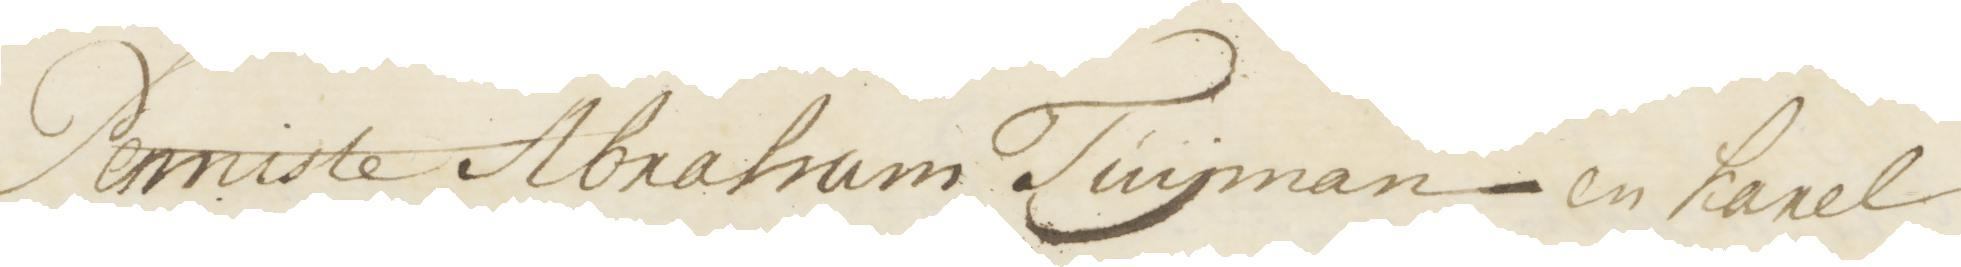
Penniste Abraham Tuijman en karel
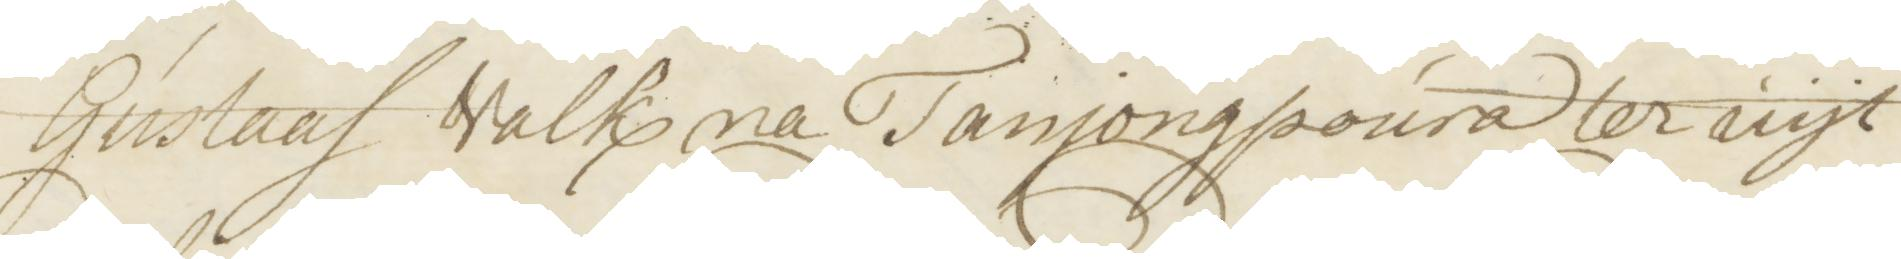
Gustaaf Valk na Tanjongpoura ter uijt
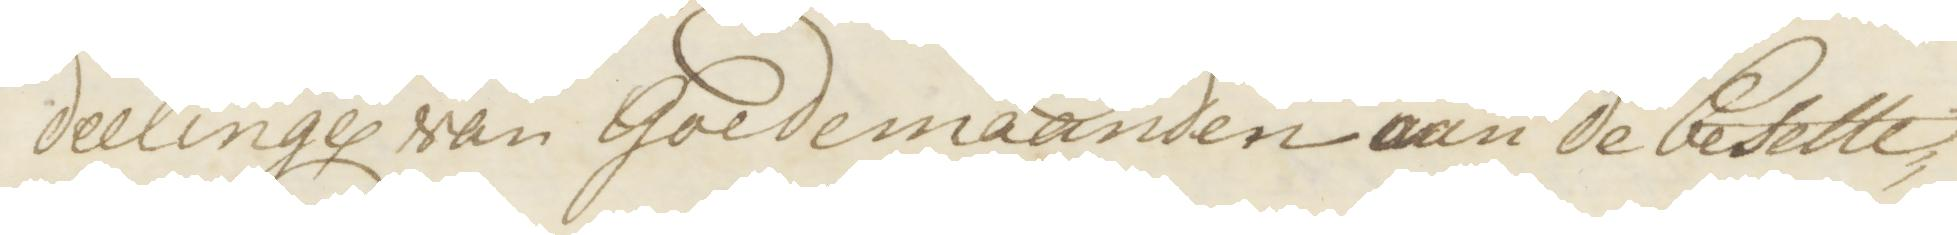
deelinge van goede maanden aan de besette„
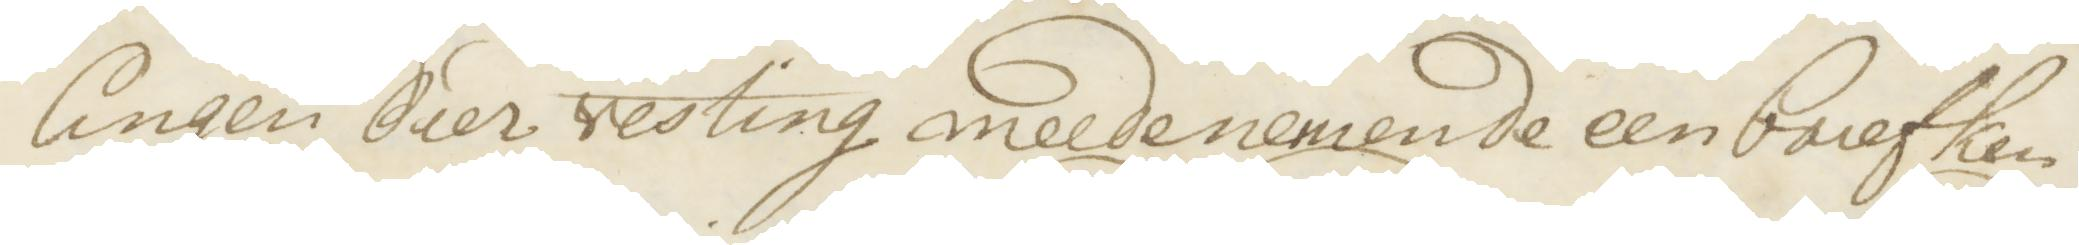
lingen dier vesting meedenemende een briefken
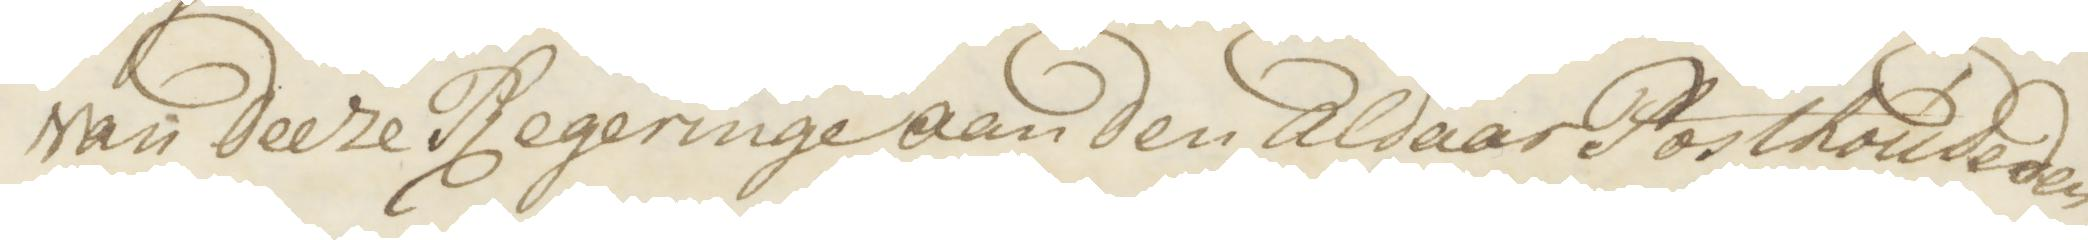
van deeze Regeringe aan den aldaar Posthoudeden
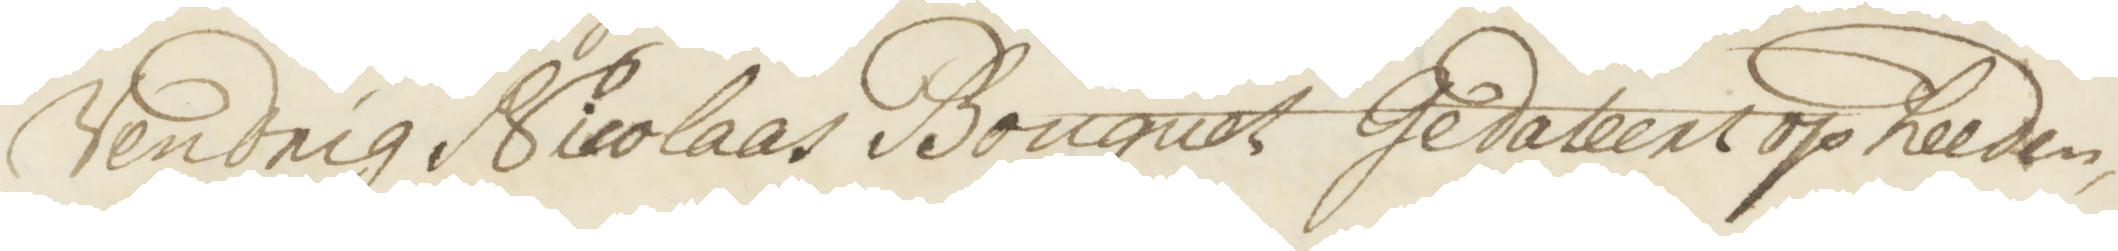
vendrig Nicolaas Bouquet gedateert op heeden,
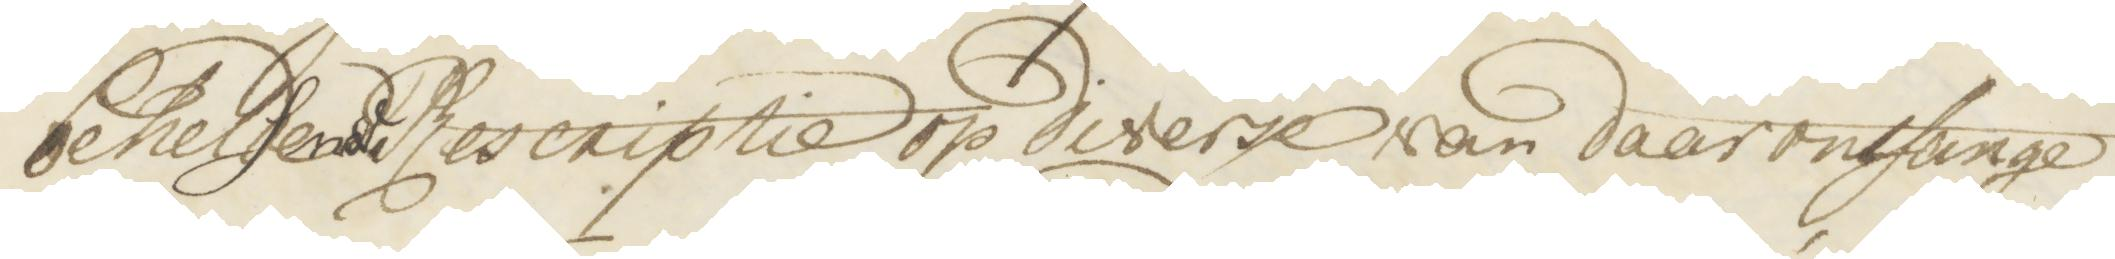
behelsende Rescriptie op diverse van daar ontfange
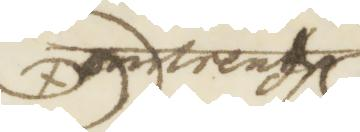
x omtrent
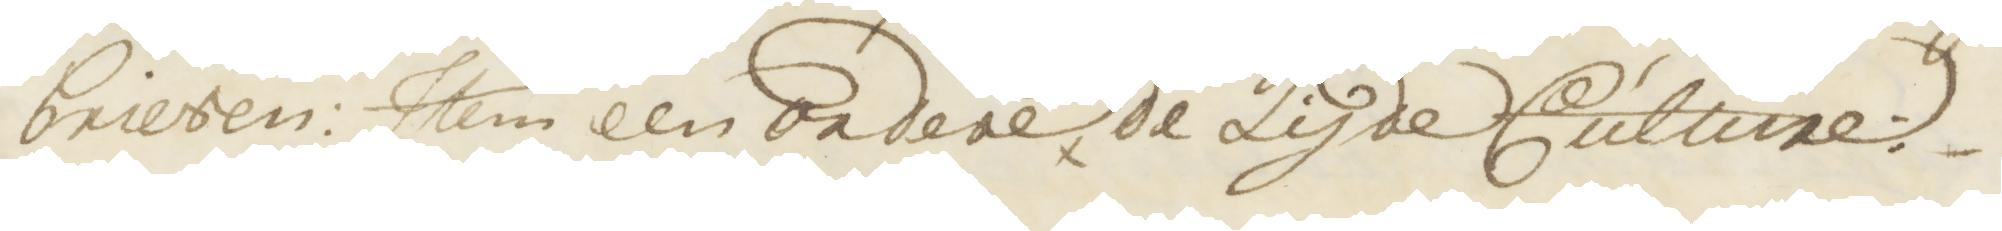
brieven: Jtem een ordere x de Zijde Culture:
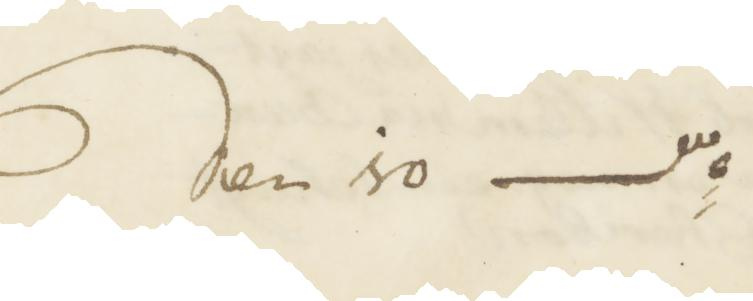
den 10 _„o
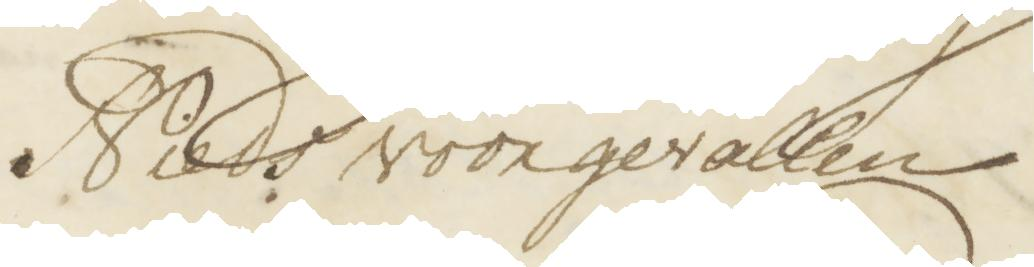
Nieds voorgevallen
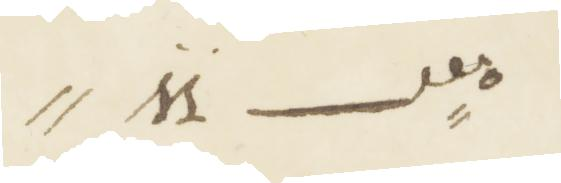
„ 11 _e„o
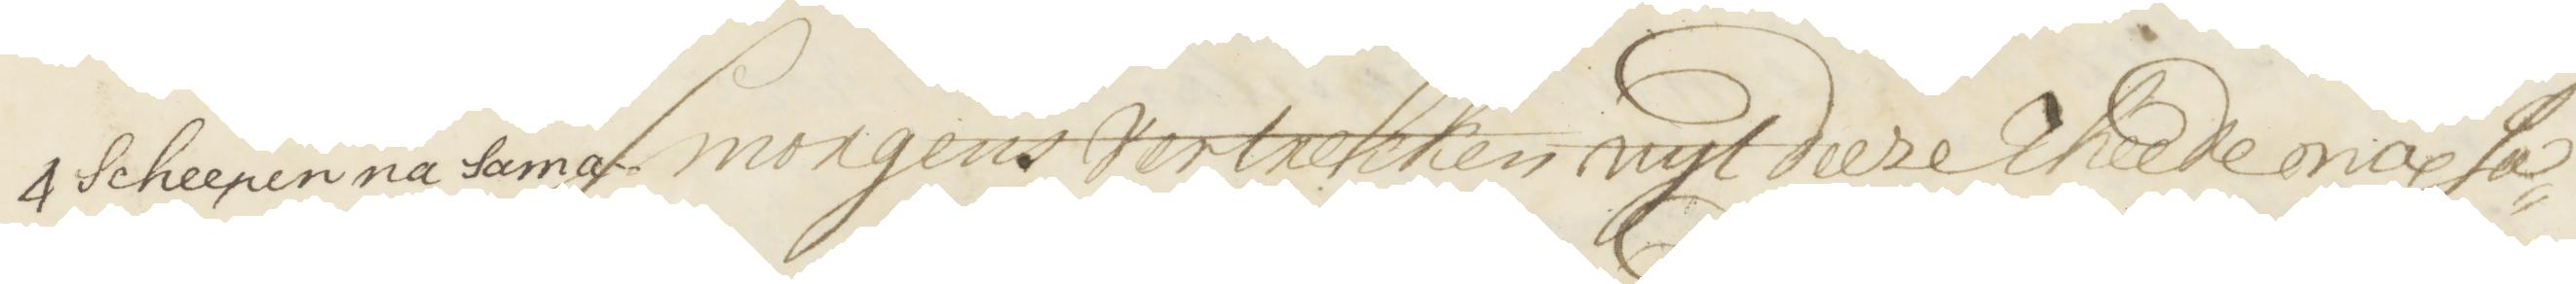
4 scheepen na sama Smorgens vertrekken uyt deeze rheede na Sa„
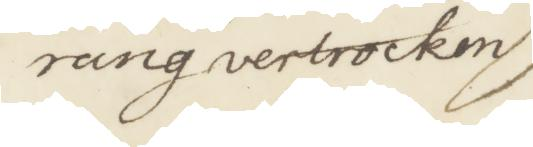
rang vertrocken,
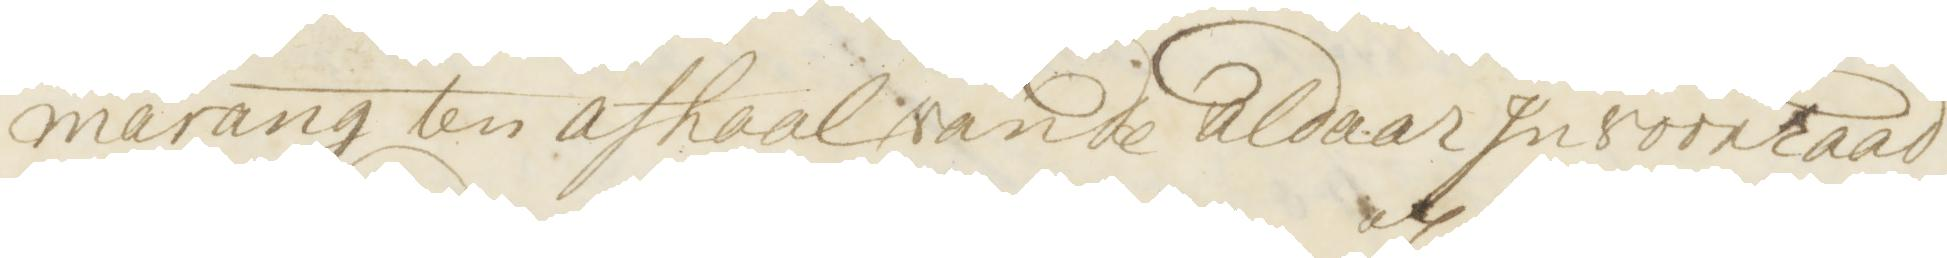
marang ten afhaal van de aldaar Jn voorraad
